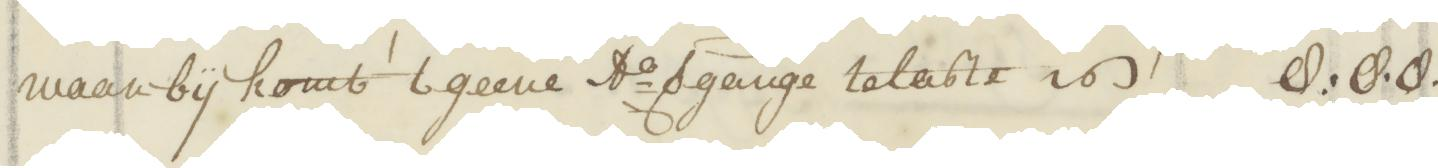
maar bij komt ’t geene A=o vergange telaste is 8:8.8
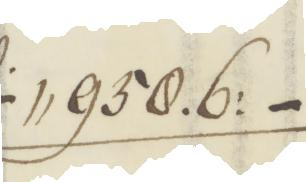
„958.6: –
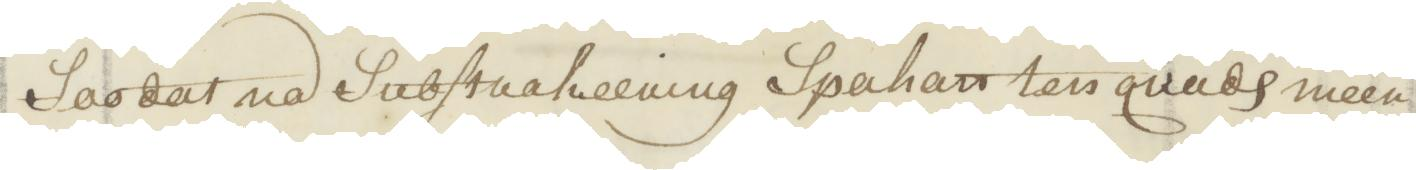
soo dat na substraheering spahan ten quaden meer
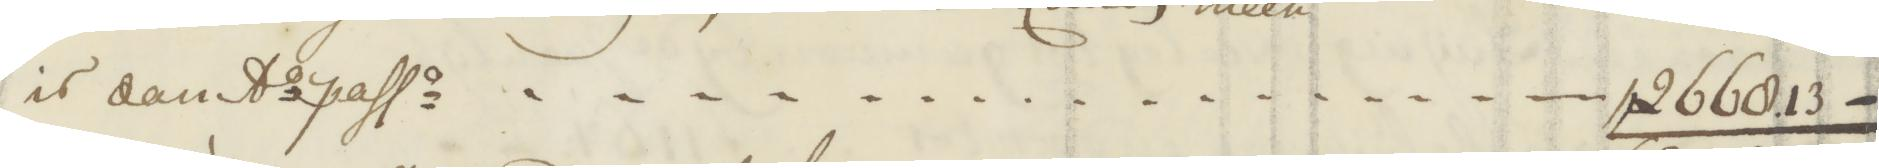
is dan A=o pass=o – – – – – - - . - - - - - - – – –„2668.13 –
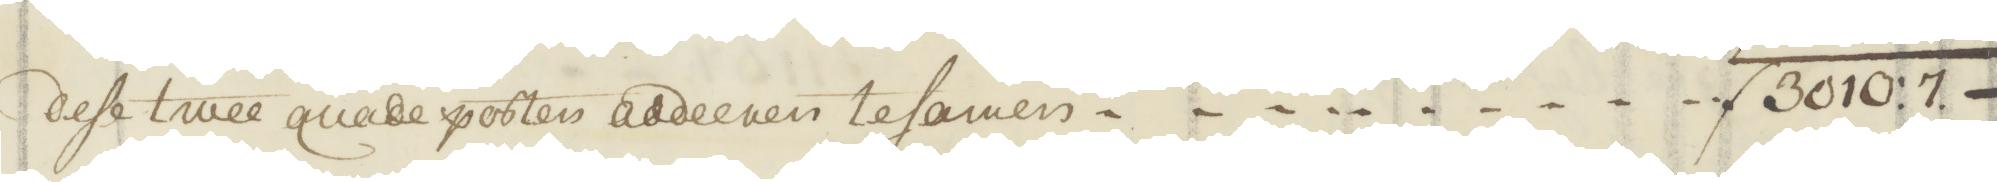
dese twee quade posten addeeren tesamen – – – - – - – – – – -ƒ3010:7. –
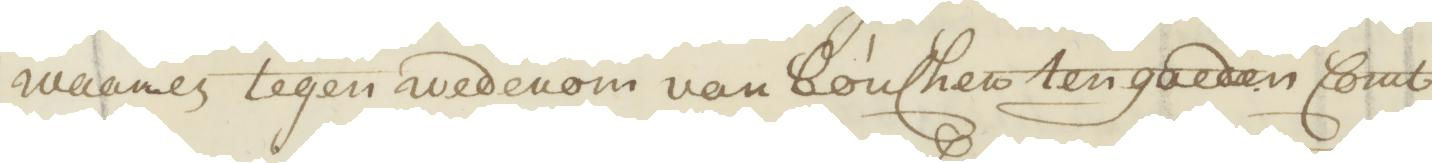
waaren tegen wederom van boucher ten goeden Comt
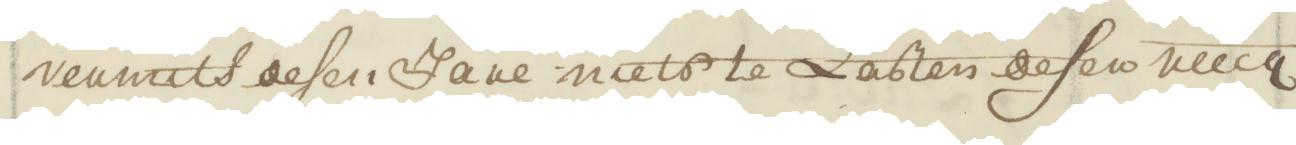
vermits desen Iare niets te Lasten deser reecq
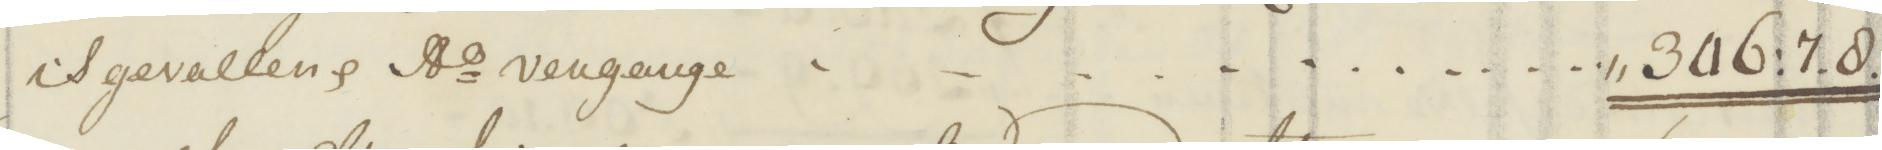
is gevallens A=o vergange – – - - - - . . - . - - .„ 346:7.8.
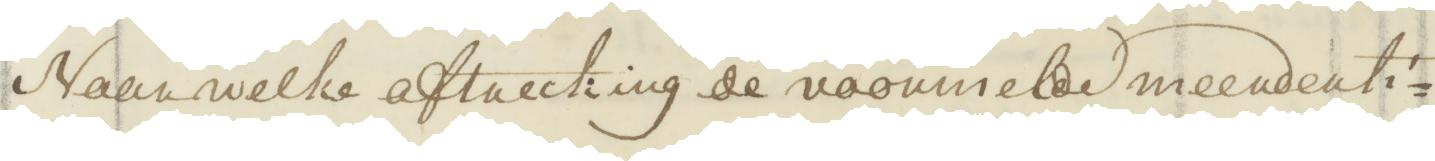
Naar welke aftrecking de voormelde meerderh=t
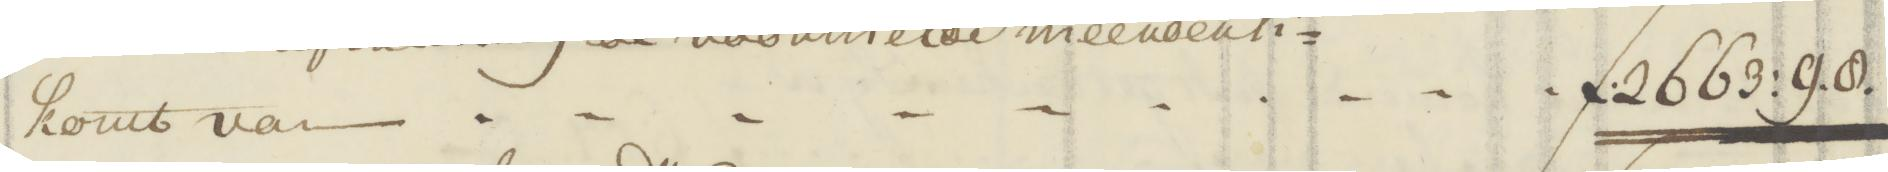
komt van - – – – – – - – – - ƒ.2663:9.8.
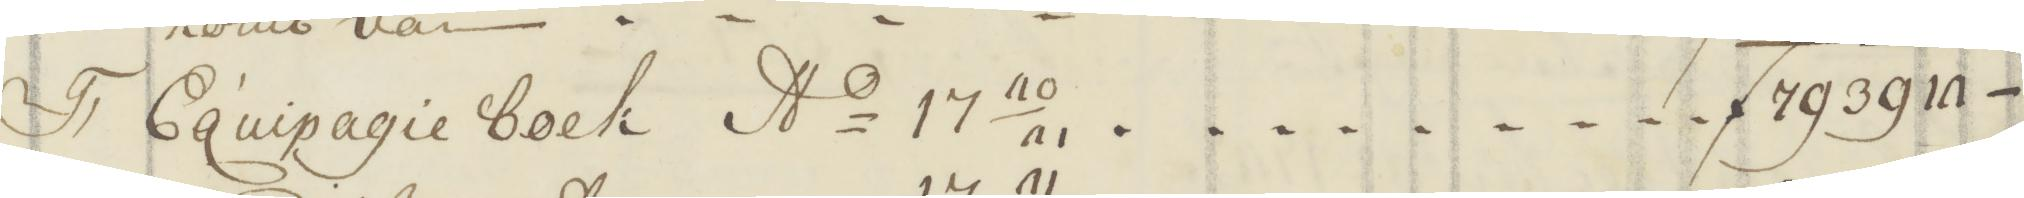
T' Equipagie boek A=o 17 40/41 - - - - - – – – – ƒ 793914 –
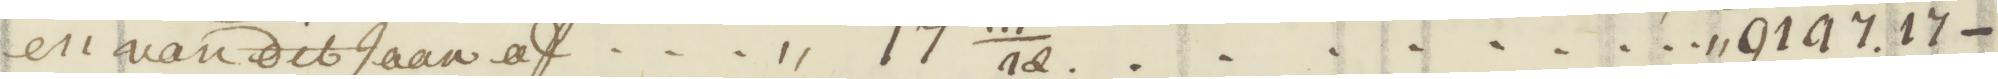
en van dit Jaar af - - - „ 17 41/42 . . - . . - - . . .„ 9147.17 –
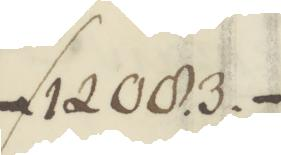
ƒ1208.3.–
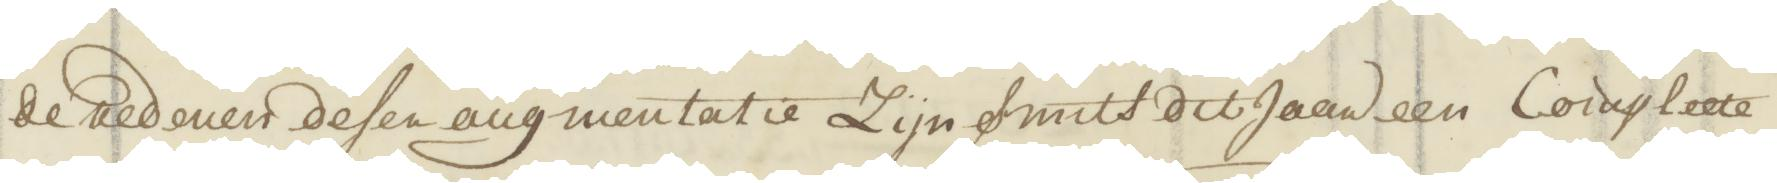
de redenen deser augmentatie zijn vermits dit jaar een Compleete
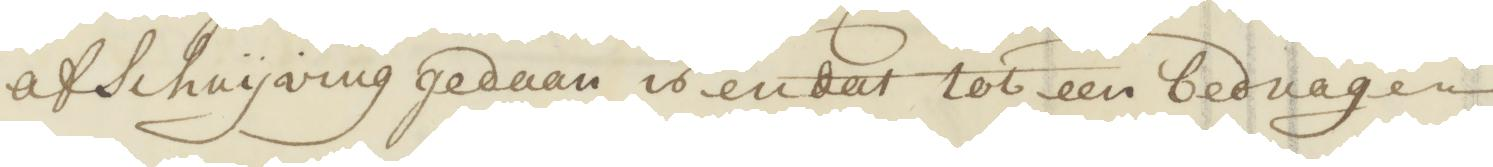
afschrijving gedaan is en dat tot een bedragen
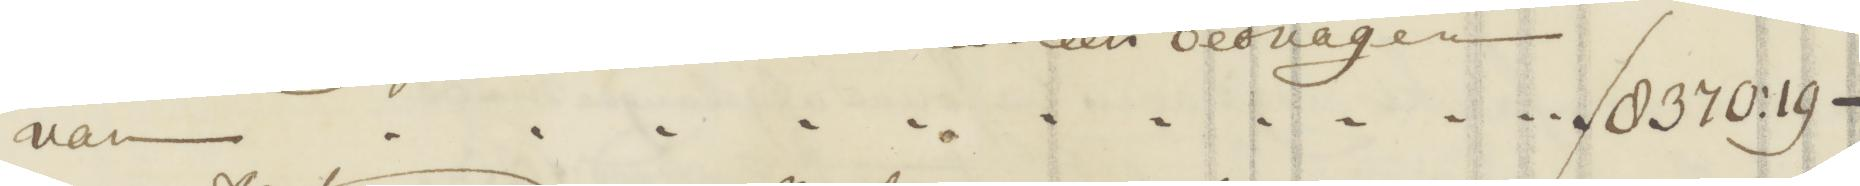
van - - - - - - - - - - - - ƒ8370:19 –
